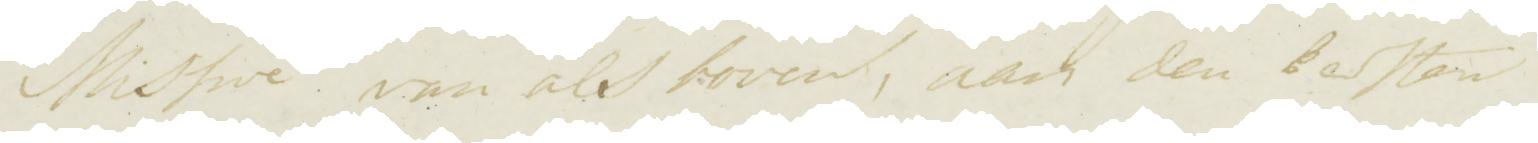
Missive van als boven, aan den Eersten
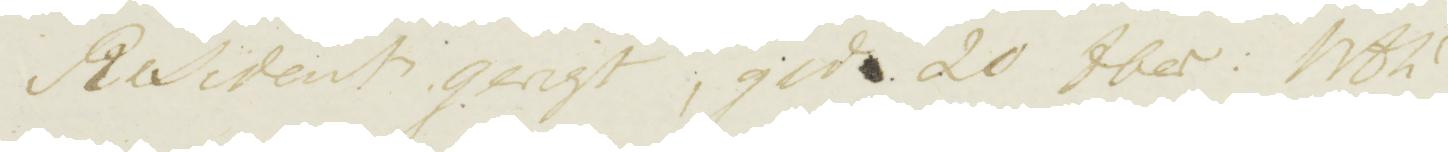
Resident gerigt , ged. 20 8ber: 1782
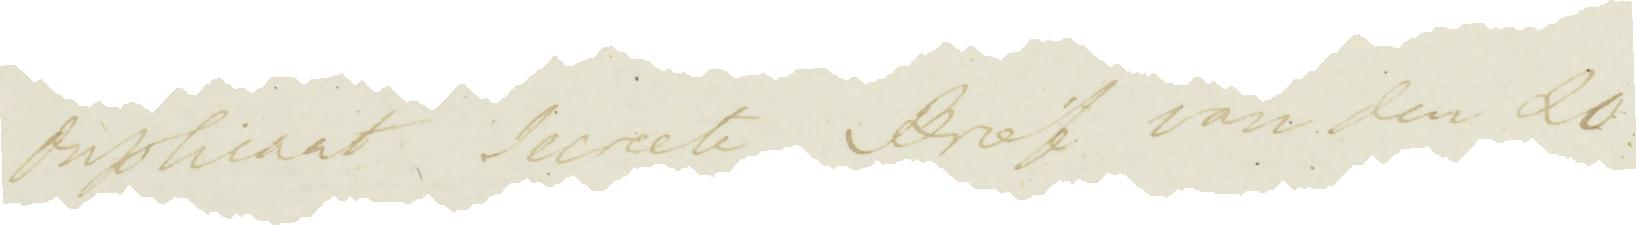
duplicaat secreete Brief van den 20.
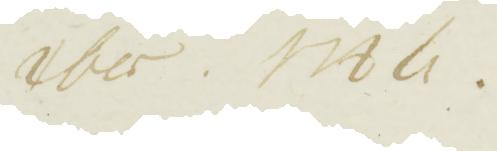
xber: 1784.
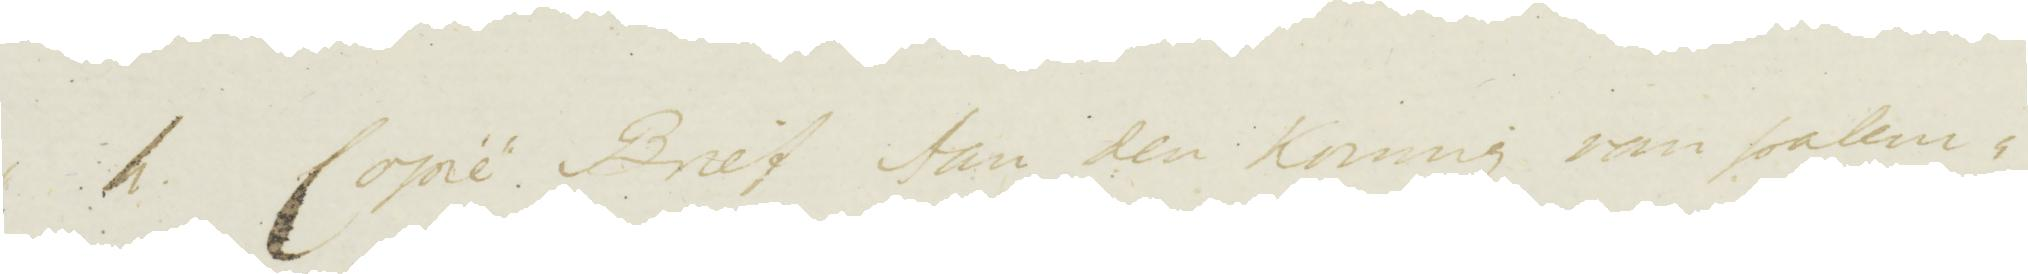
4.: Copie Brief Aan den Koning van palem„
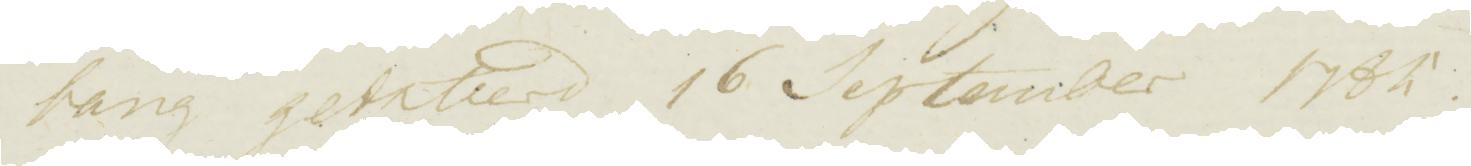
bang gedateerd 16 Septemder 1785.
